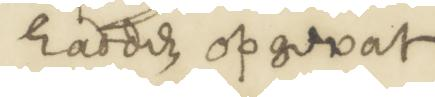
hadden op gevat
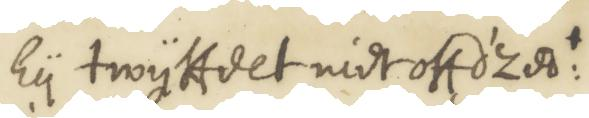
hij twijffelt niet off d' zed:t
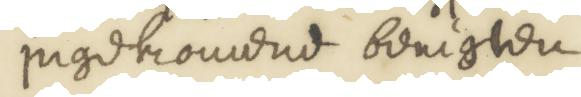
ingekomene berigten
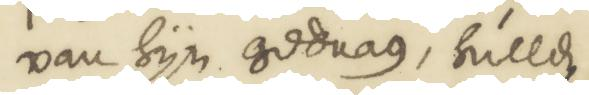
van sijn gedrag, sullen
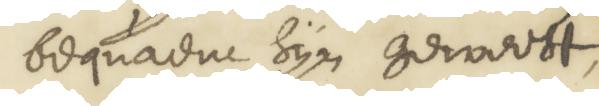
bequaem sijn geweest,
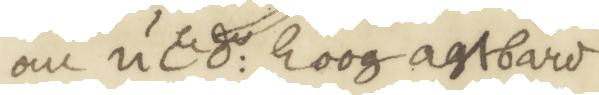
om u Ed:s hoog agtbare
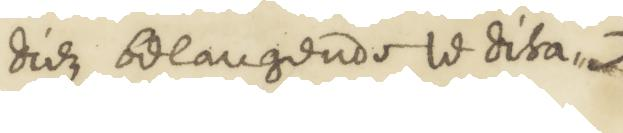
dien belangende te disa„
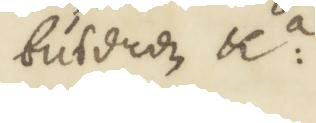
buseren Et:a
